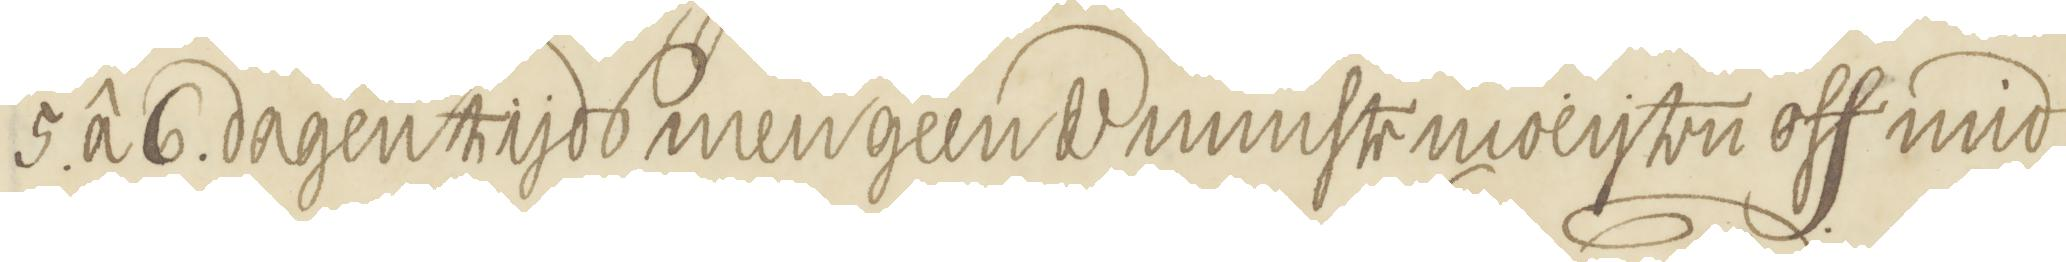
5. â 6. dagen tijds men geen de minste moeijten off mid
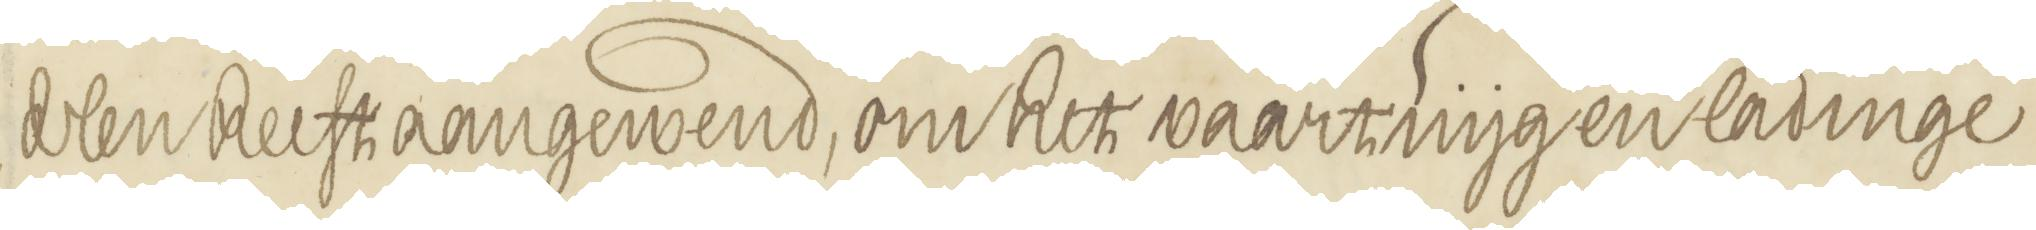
„delen heeft aangewend, om het vaartuijg en ladinge
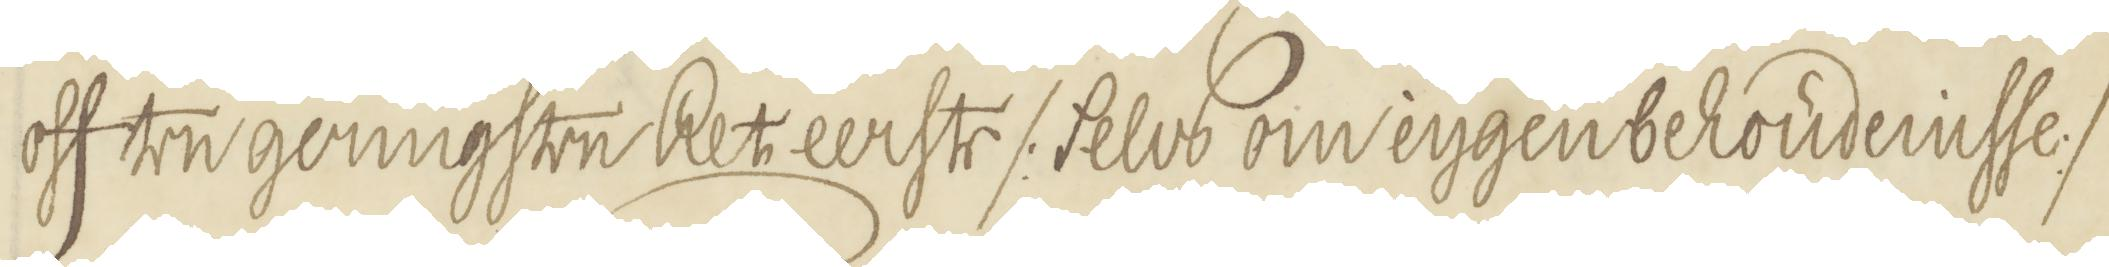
off ten geringsten het eerste /: Selvs om eijgen behoudenisse :/
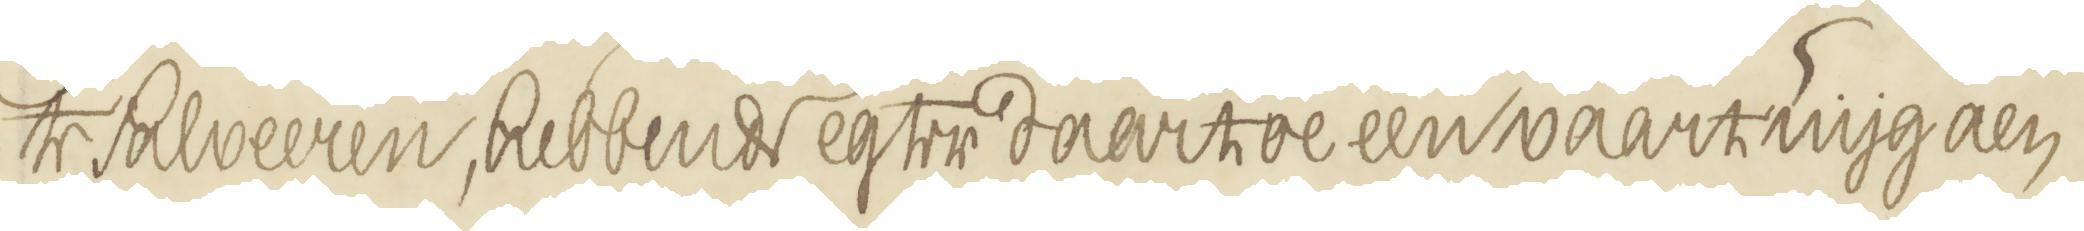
te Salveeren, hebbende egter daartoe een vaartuijg aen
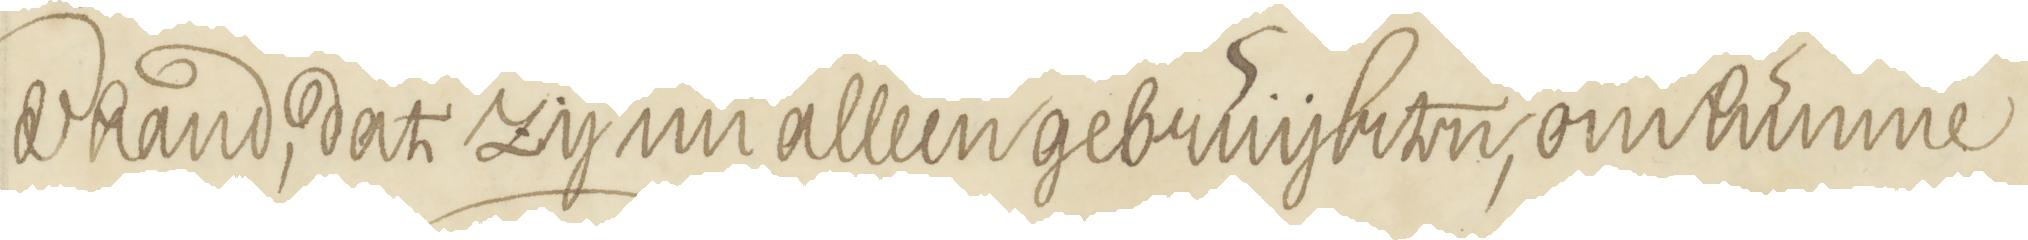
de hand, dat zij nu alleen gebruijkten, om hunne
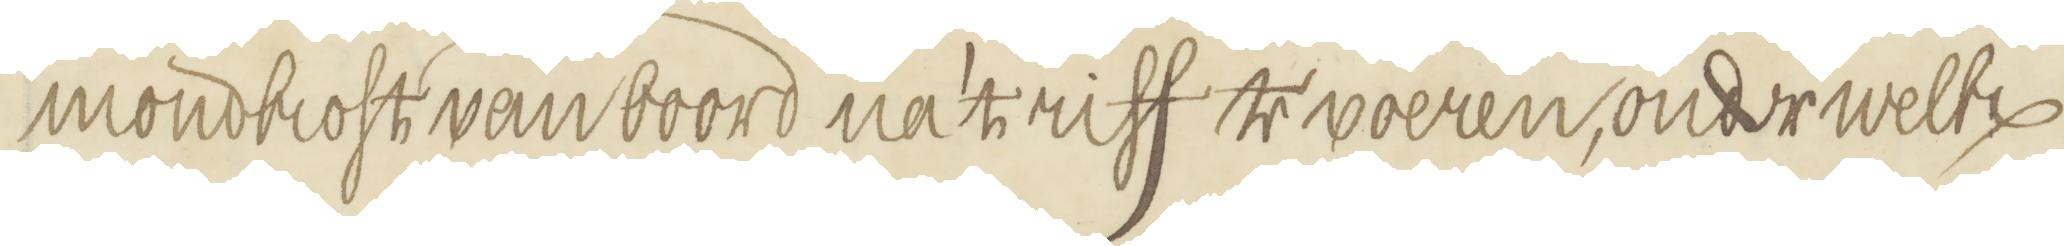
mondkost van boord na 't riff te voeren, onder welk
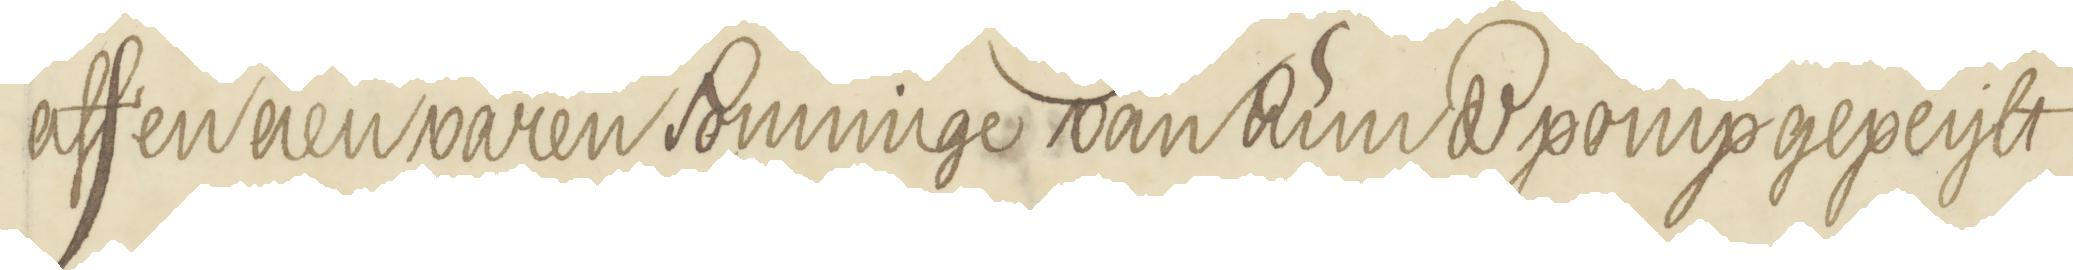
affen aen varen Sommige van hun de pomp gepeijlt
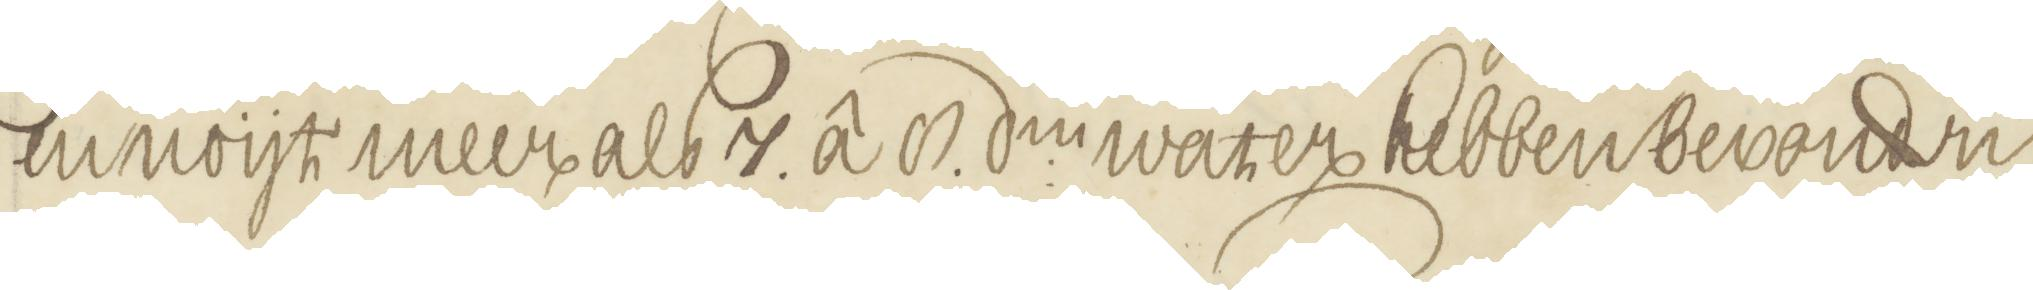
en noijt meer als 7. â 8. d:m water hebben bevonden,
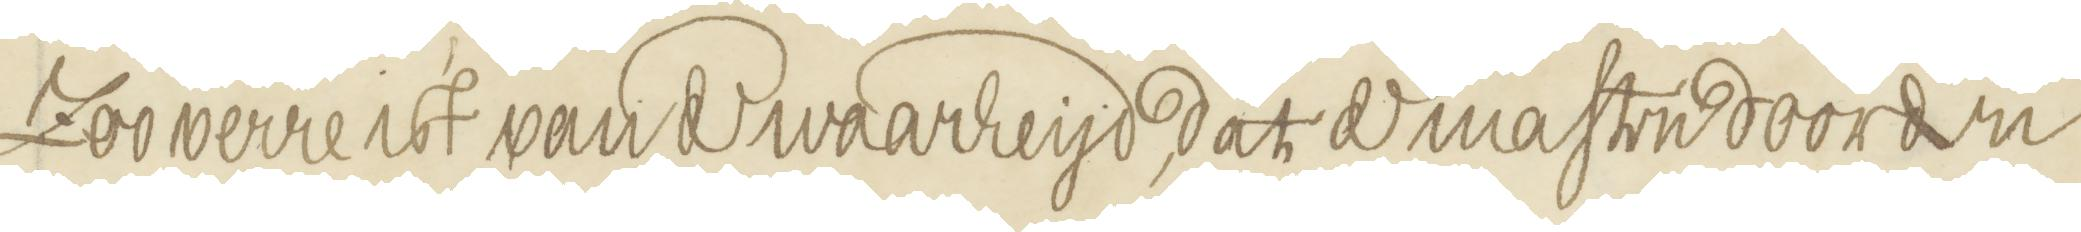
Zoo verre is 't van de waarheijd, dat de masten door den
